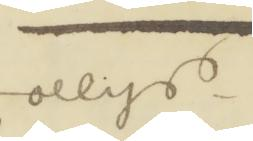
Collijs
